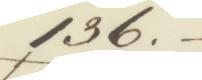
136.—
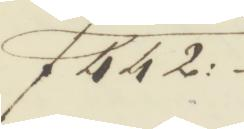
ƒ 442:—
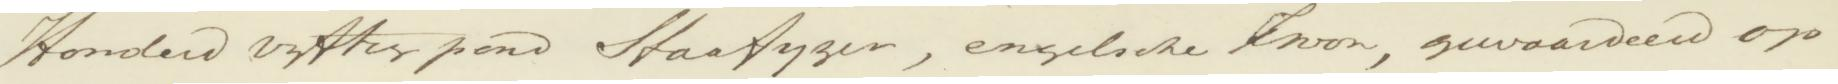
Honderd vijftig pond staafyzer, engelsche toon, gewaardeerd op
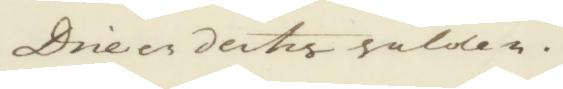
Drie en dertig gulden.
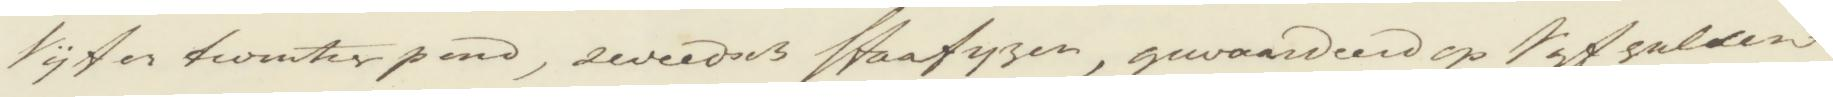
Vijf en twintig pond, zweedsch staafyzer, gewaardeerd op Vyf gulden
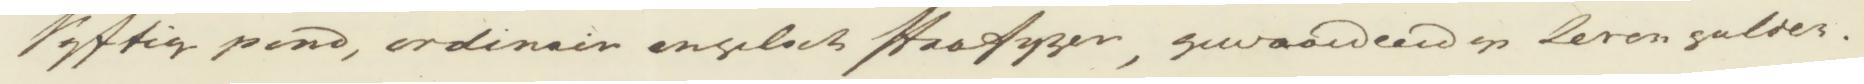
Vyftig pond, ordinair engelsch stqafyzer, gewaardeerd op Zeven gulden.
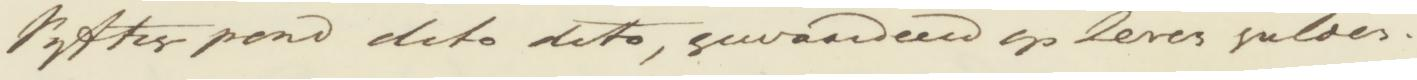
Vyftig pond dito dito, gewaardeerd op Zeven gulden.
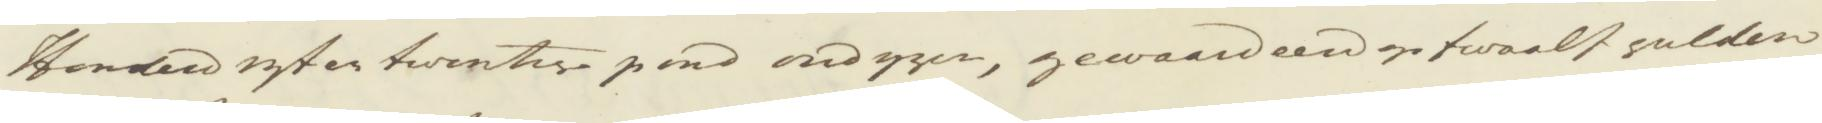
Honderd vyf en twintig pond oud yzer, gewaardeerd op twaalf gulden
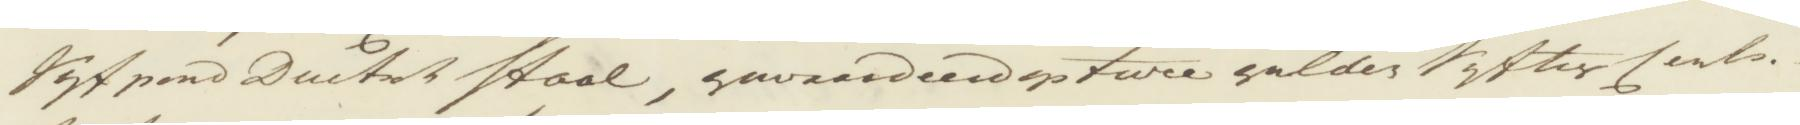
Vyf pond Duitsch staal, gewaardeerd op twee gulden Vyftig Cents.
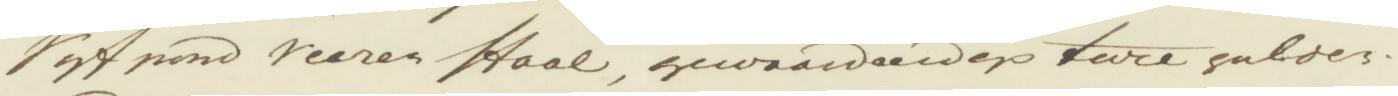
Vyf pond veeren staal, gewaardeerd op twee gulden.
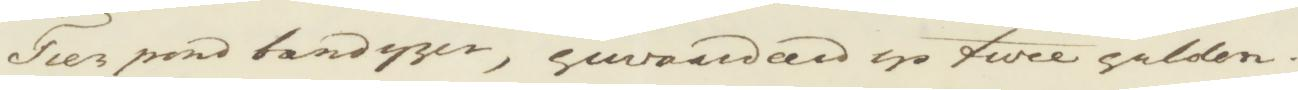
Tien pond bandyzer, gewaardeerd op twee gulden.
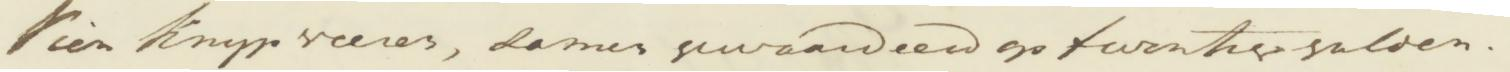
Vier knypveeren, zamen gewaardeerd op twintig gulden.
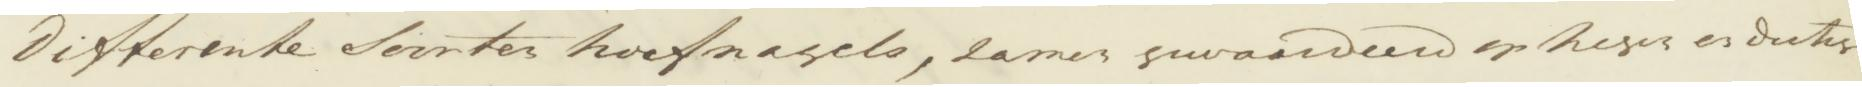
differente soorten hoefnagels, zamen gewaardeerd op Zeven en dertig
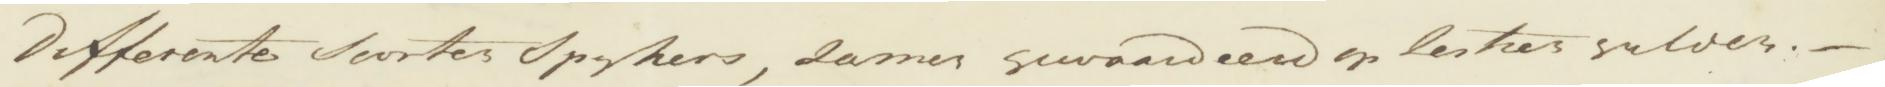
differente soorten spykers, zamen gewaardeerd op zestien gulden.—
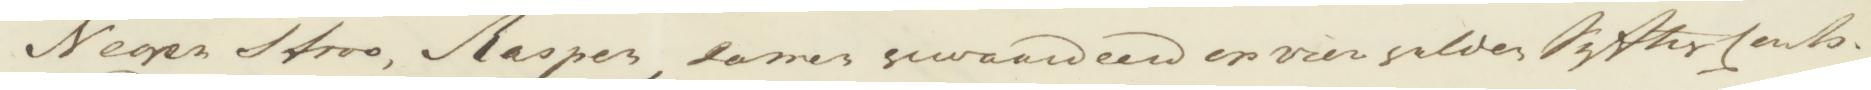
Negen Stroo, Raspen zamen gewaardeerd op vier gulden Vyftig Cents.
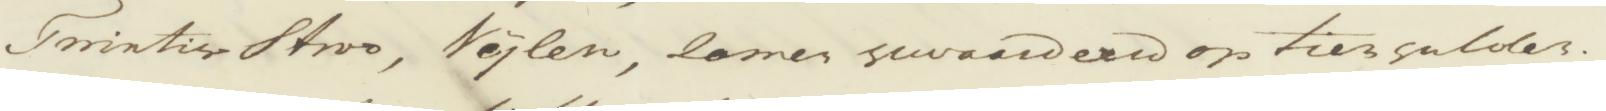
Twintig Stroo, Vijlen, zamen gewaardeerd op tien gulden.
